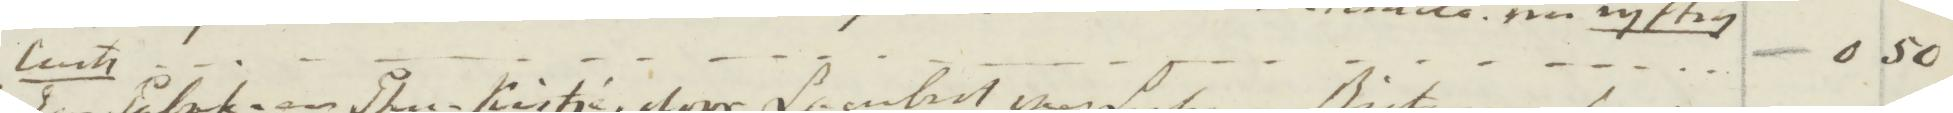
Cents - - - - - - - - - - - - - - - - - - - - - - - - - - - - - - - - - - - - - - - - - - - - - - — 0 50
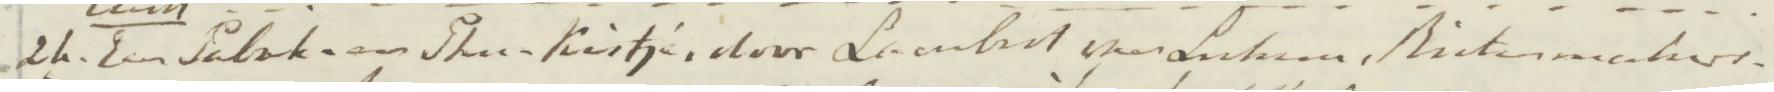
24. Een Tabak - en Thee- kistje, door Lambert van Latum, Rietenmakers-
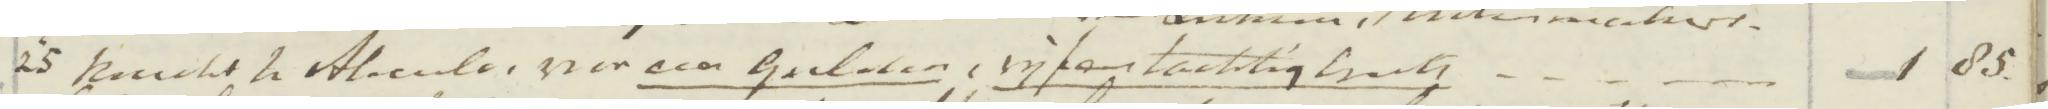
25 Knecht te Almelo, voor een Gulden , vijfen tachtig Cents - - - - - — 1 85.
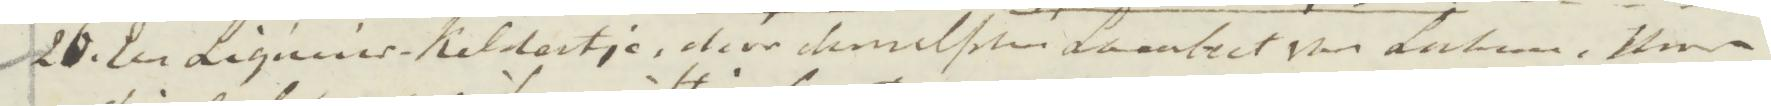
26. Een Liqueur-Keldertje, door dezelfden Lambert van Latum, Voor
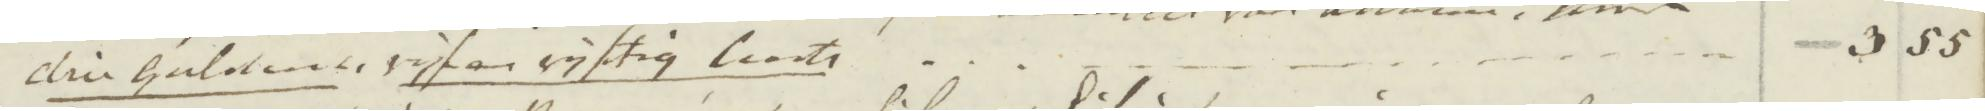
drie Guldens, vijf en vijftig Cents - - - - - - - - - - - - - - - - - - - - - - - - - - - — 3 55
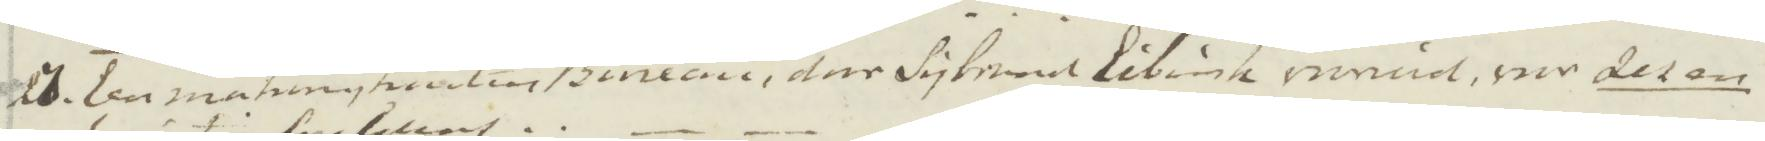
27. Een mahonijhouten Bureau, door Sijbrand Eibink voorozeid, voor Zes en
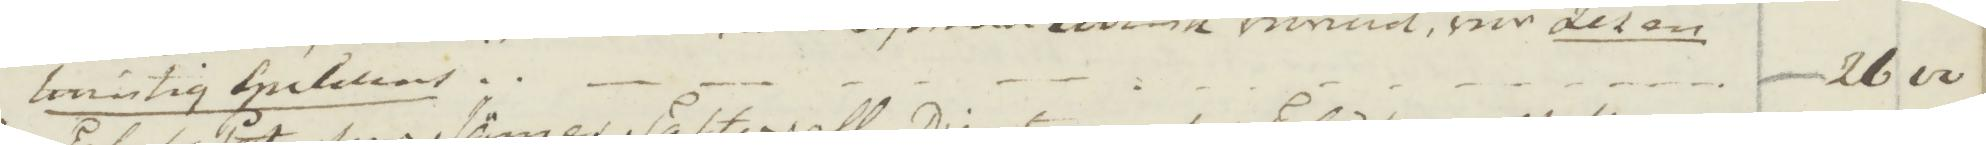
twintig Guldens . . - - - - - - -- - - - - - - - -- - - - - - - - - - - - - - - - - - - -- - — 26 00
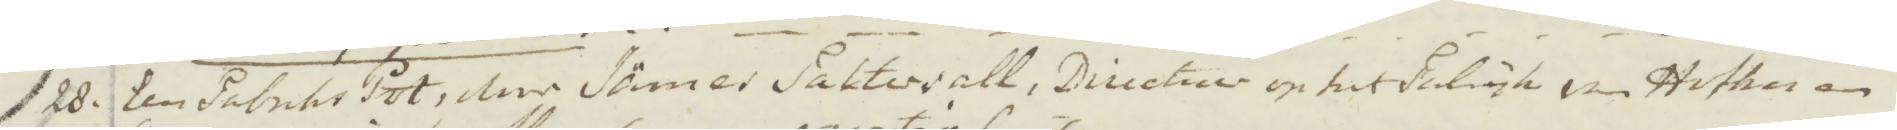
28. Een Fabrieks Pot, door Iames Fattervall, Directeur op het Fabrijk van Heffer en
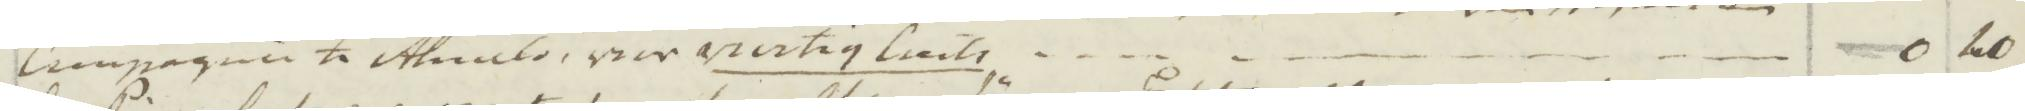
Compagnie te Almelo, voor veertig Cents - - - - - - -- - - - - -- - - - - - - - - - - — 0 40
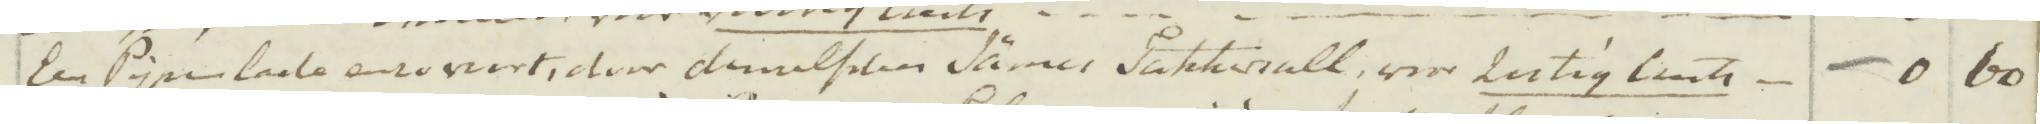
Een Pijpenlade enzo voort, door dezelfden James Takkenvall, voor Zestig Cents- 0 60
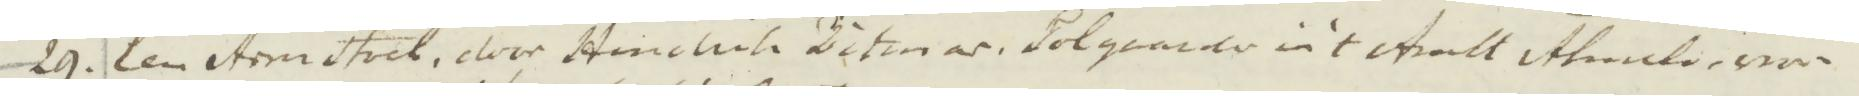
29. Een Armstoel, door Hendrik Ditmar, Tolgaarder in ’t Ambt Almelo, voor
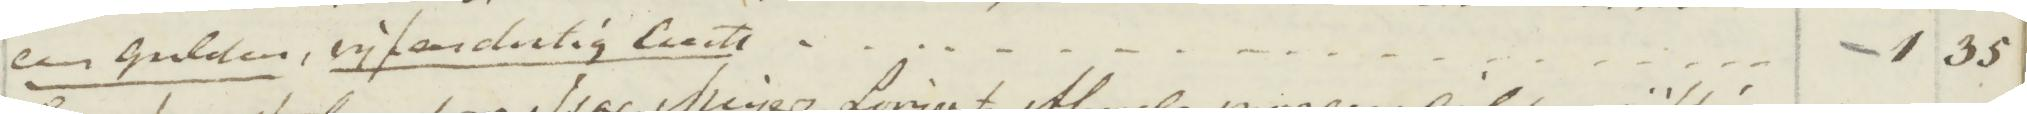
een gulden, vijf endertig Cents - - - - - - - - - - - - - - - - - - - - - - - - - - - - - - - - - —1 35
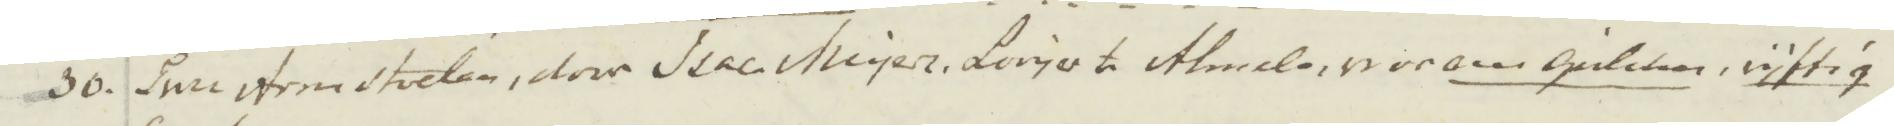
30. Twee Armstoelen, door Isaac Meijerz, Looijer te Almelo, voor een Gulden, vijftig
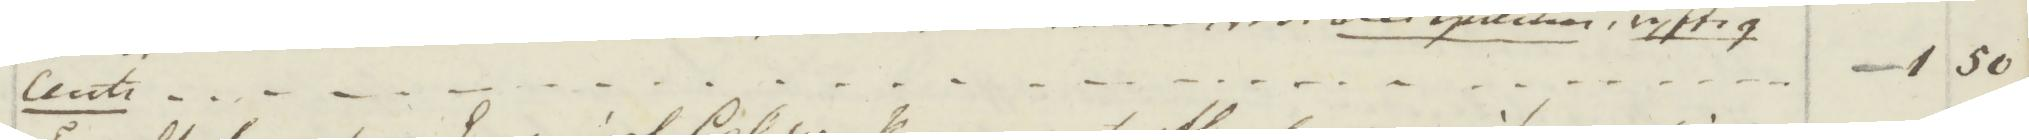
Cents - . - - - - - - - - - - - - - - - - - - - - - - - - - -- - - - - - - - - - - - - - - - - - - - „ — 1 50
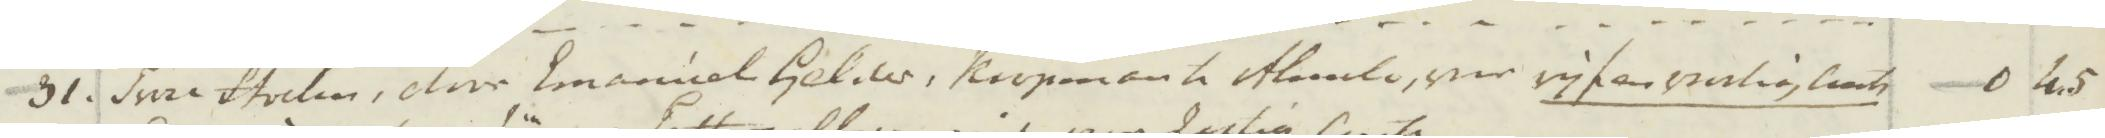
31. Twee stoelen, door Emanuel Gelder, koopman te Almelo, voor vijf en veertig Cents —0 45
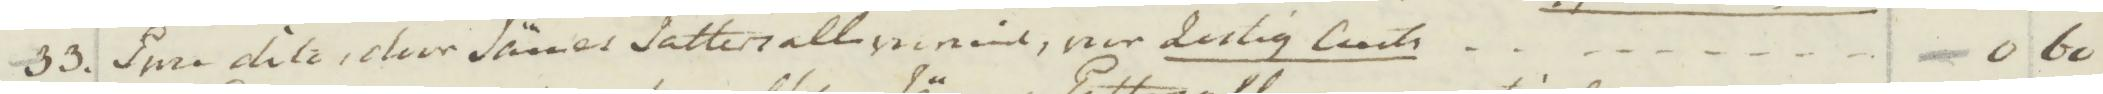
33. Twee dito, door Jämes Fattervall voorzeid, voor Zestig Cents - - - - - - - - - - - - - — 60
